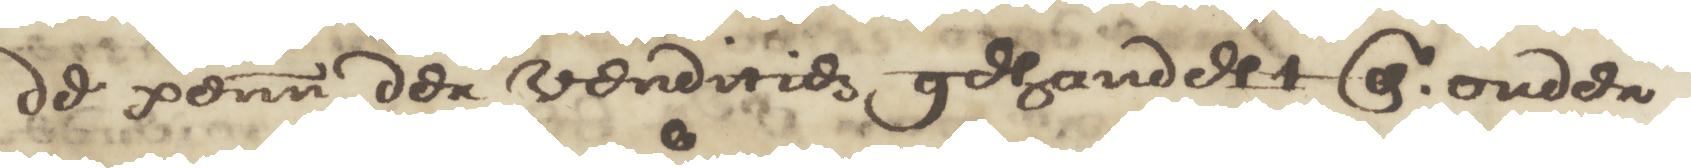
de penn der venditien gehandelt ende onder
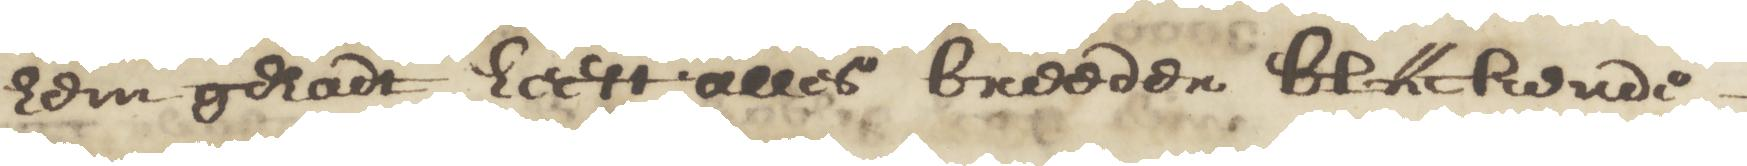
hem gehadt heeft:s alles breeder blijckende
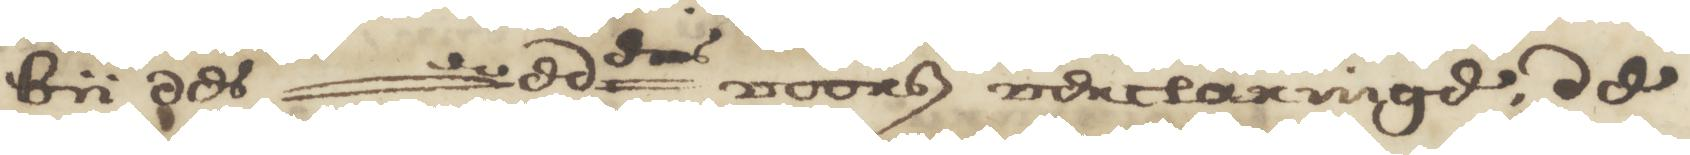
bij des Ged=ens voorsz verclaringd, de
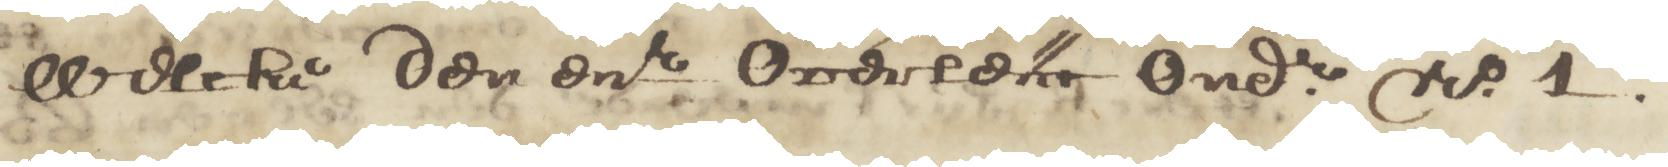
welcke den en=r Overleijt Ond„r N„o 1:
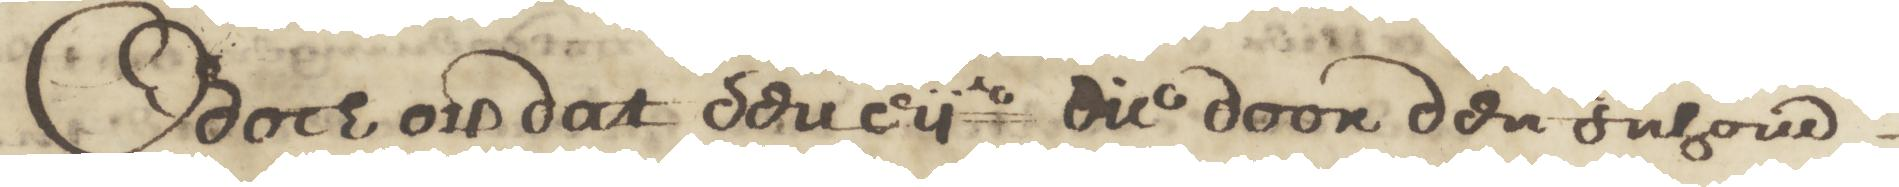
Doch op dat den eij=r die door den Inhoud
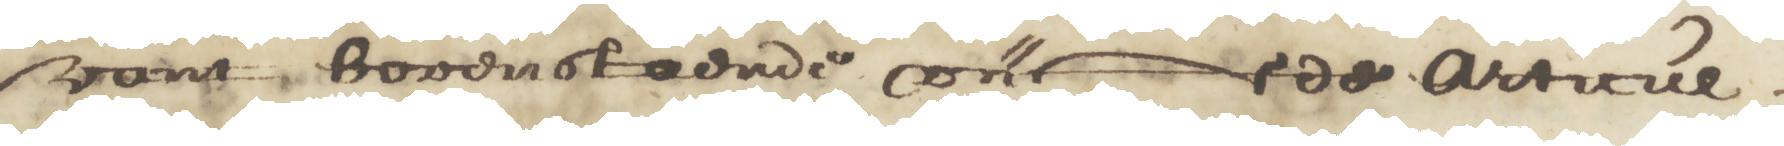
vant bovenstaende coijffde articul
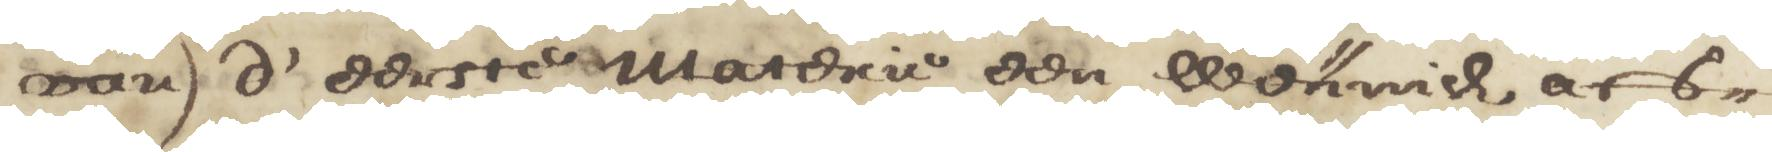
van d’ eerste materie een weijnich aff„
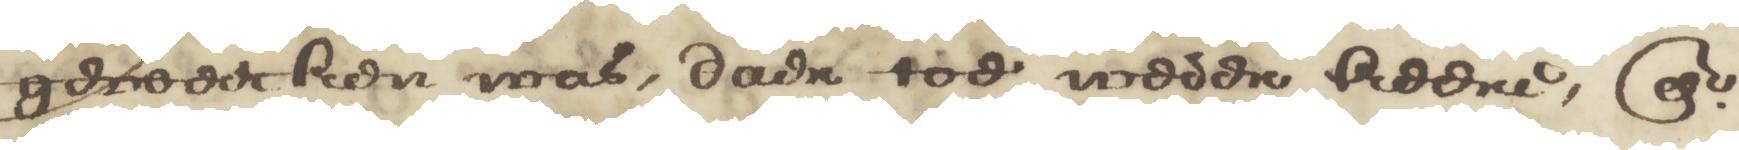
geweecken was, daer toe weder keere, ende
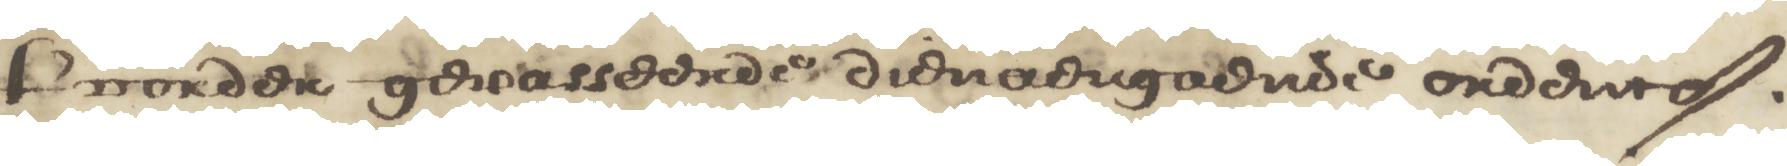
t' vorder gepasseerde dienaengaende ordentlijk
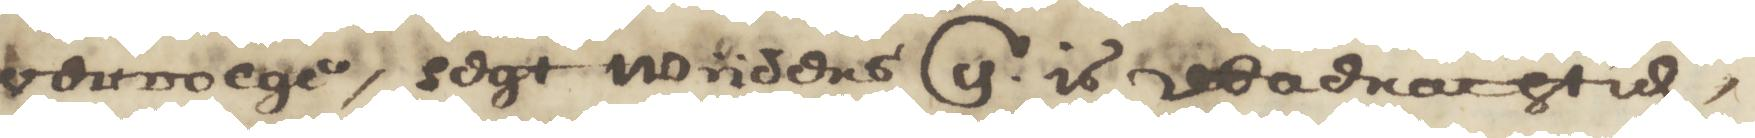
vervolge, segt wijders ende is waerachtich,
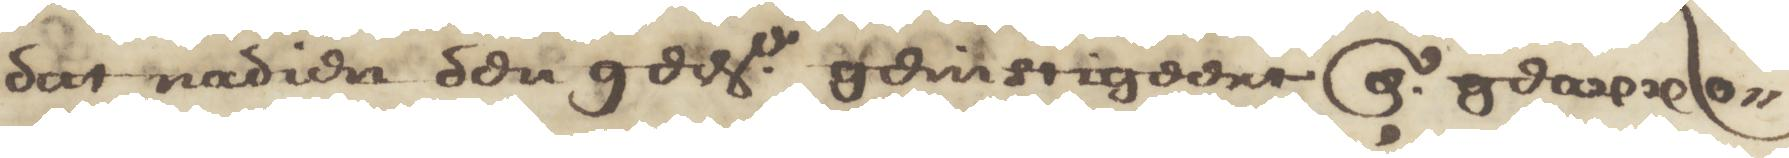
dat nadien den ged.e geinstigeert ende geappo„
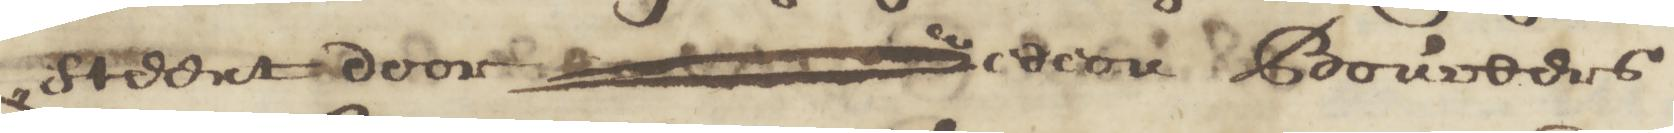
steert door Gedeor Bouwers
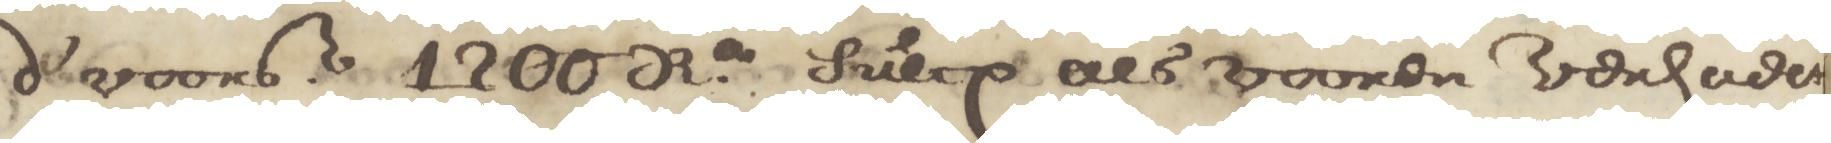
d' voors: 1200 R.a sulcx als vooren verhaelt
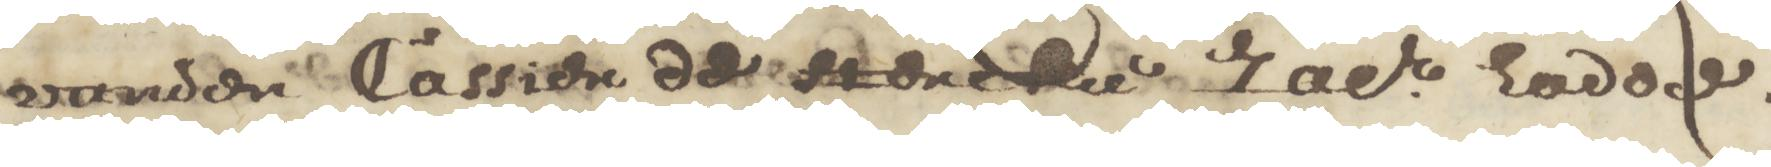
vanden Cassier de stercke Zal.r hadde
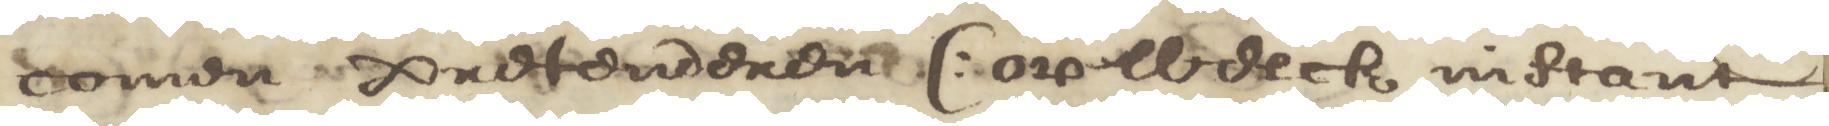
comen pretenderen (:op welck instant
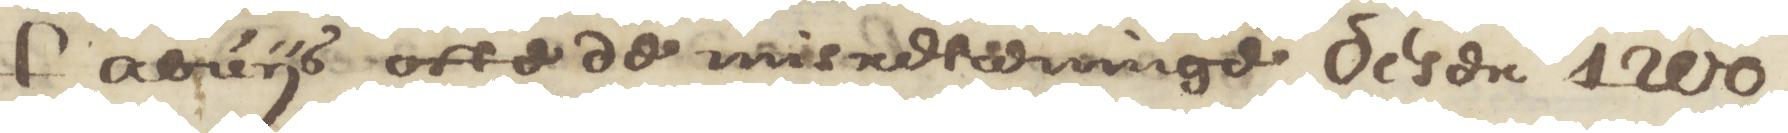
t' abuijs ofte de misrekeninge deser 1200
